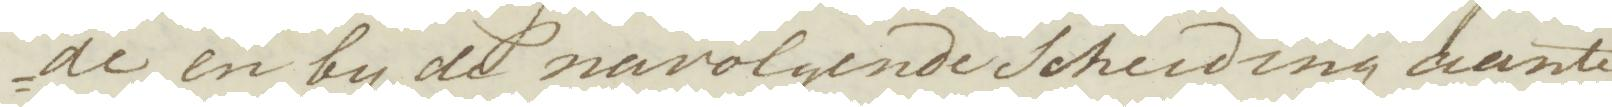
=de, en by de navolgende scheiding aante
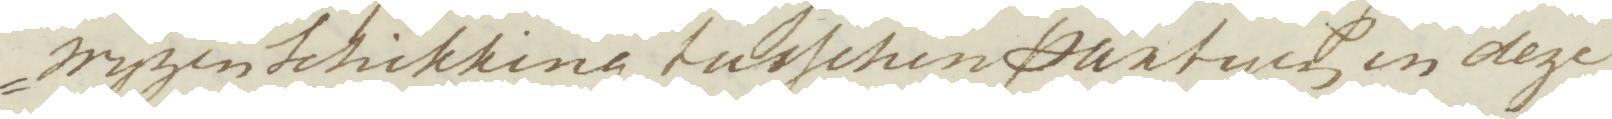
=wyzen schikking tusschen partyen in deze
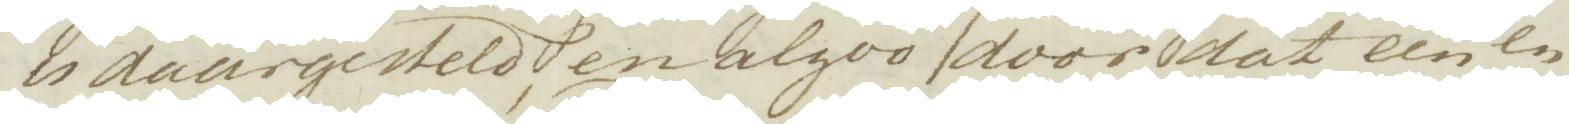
is daargesteld, en alzoo door dat een en
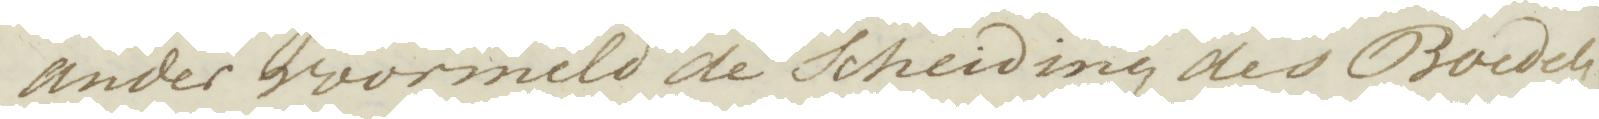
ander voormeld de scheiding des Boedels
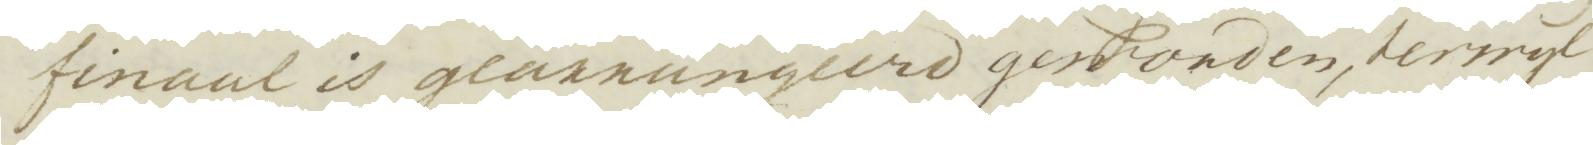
finaal is gearrangeerd geworden, terwyl
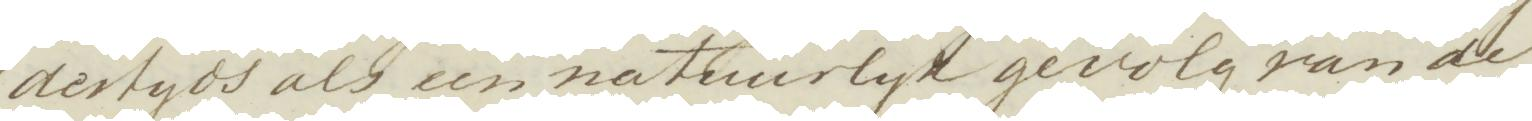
destyds als een natuurlyk gevolg van de
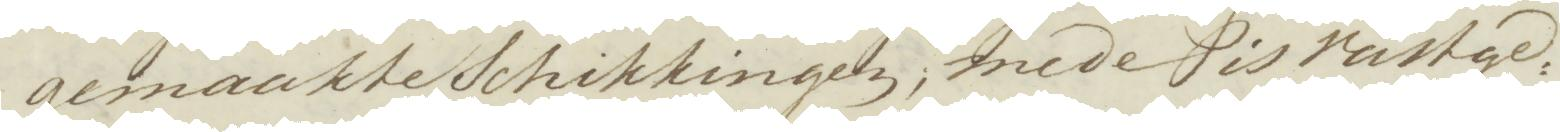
gemaakte schikkingen, mede is vastge=
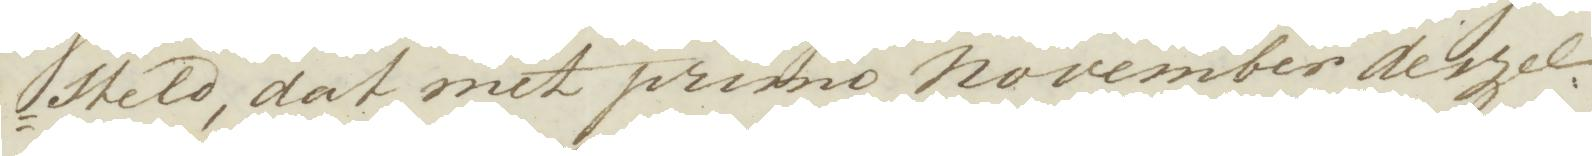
=steld, dat met primo november deszel:
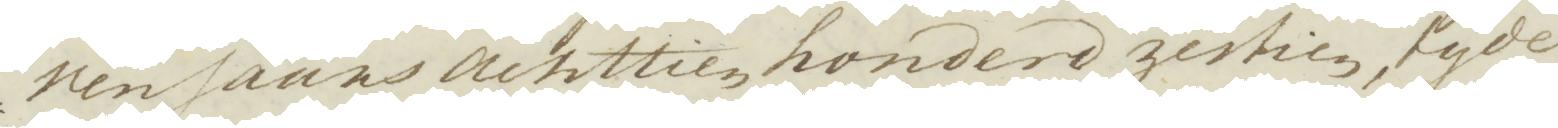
=ven jaars achttien honderd zestien, tyde
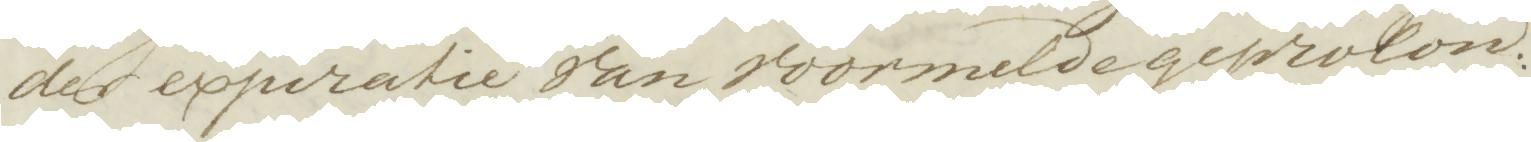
der expiratie van voormelde geprolon:
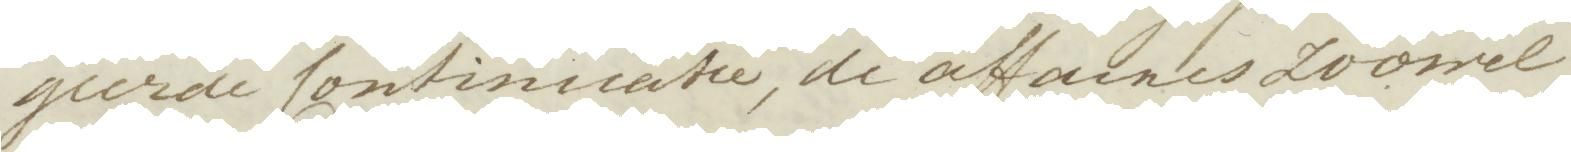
=geerde Continuatie, de affaires zoowel
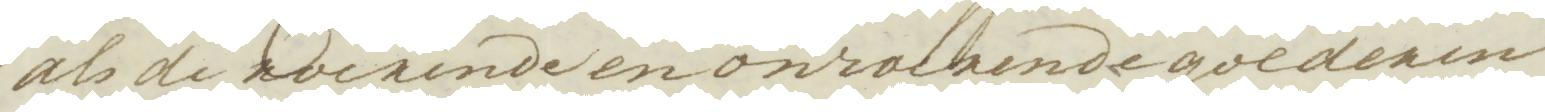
als de roerende en onroerende goederen
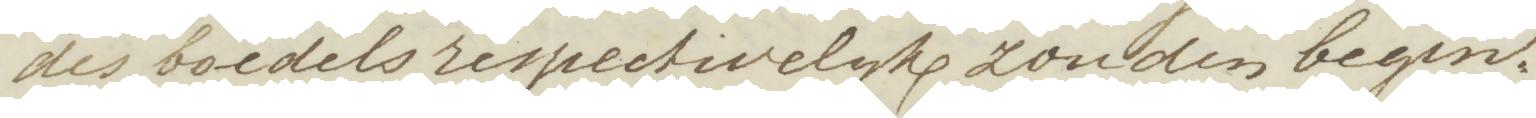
des boedels, respectivelyk zouden begin=
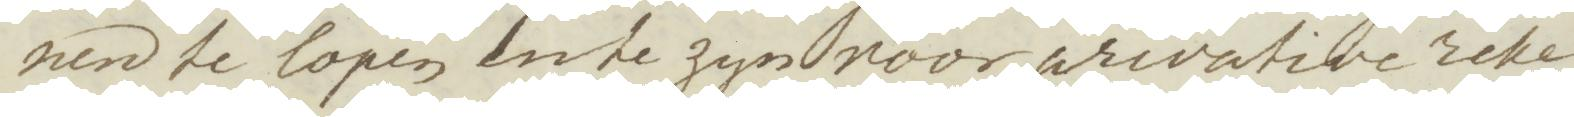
=nen te lopen en te zijn voor privative reke=
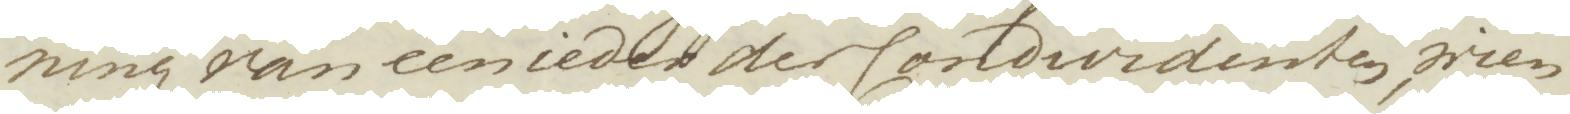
=ning van een ieder der Condividenten wien
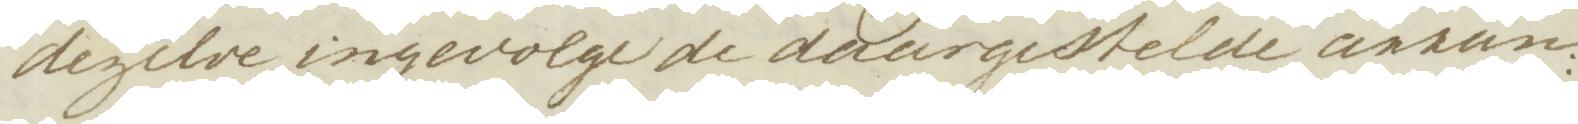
dezelve, ingevolge de daargestelde arran:
